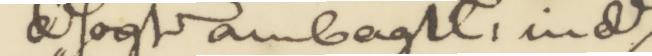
de „”versogte ambagtl: in de
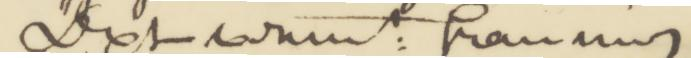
Text vern:t konnen
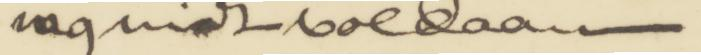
nog niet voldaan
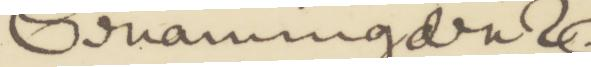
benaming der 2.
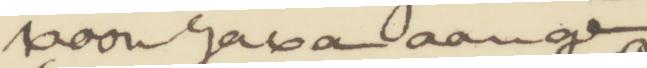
voor Java aange
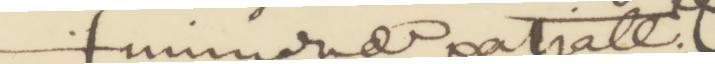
timmerde patjall:s
